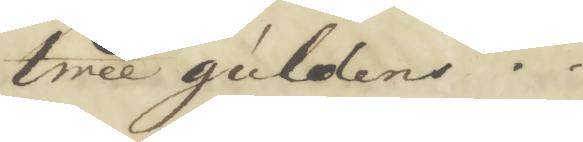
twee guldens . . . . . . . . . . „ 2. —
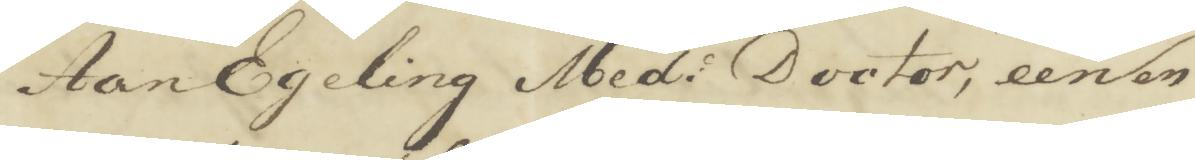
Aan Egeling Med:e Doctor, een en
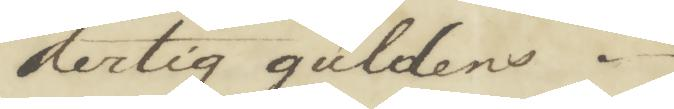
dertig guldens . . . . . . . . . „ 31. —
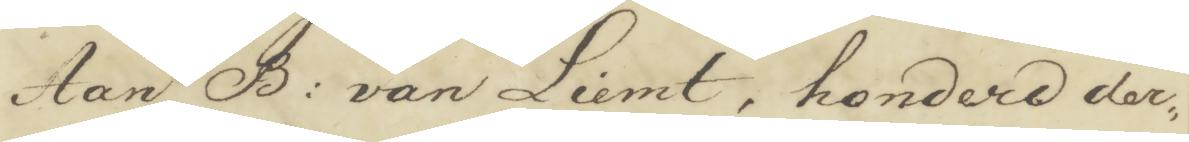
Aan B: van Liemt, honderd der„
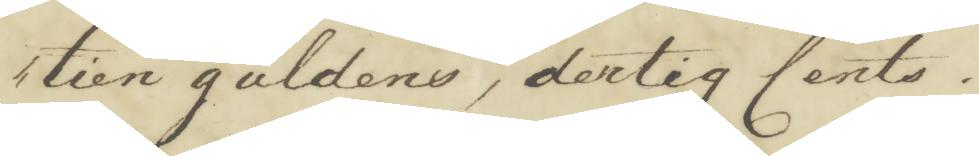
„tien guldens, dertig Cents . . . . „ 113. 30
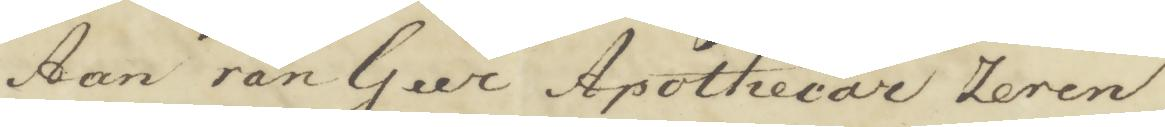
Aan van Geer Apothecar Zeven
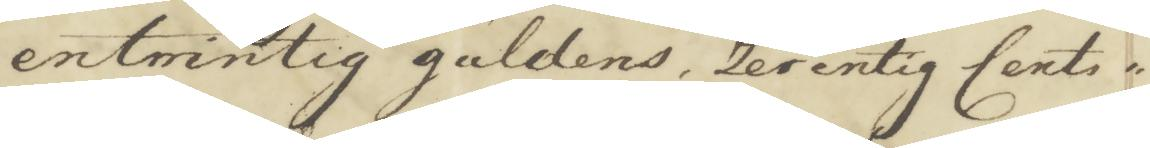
en twintig guldens, zeventig Cents „ 27. 70.
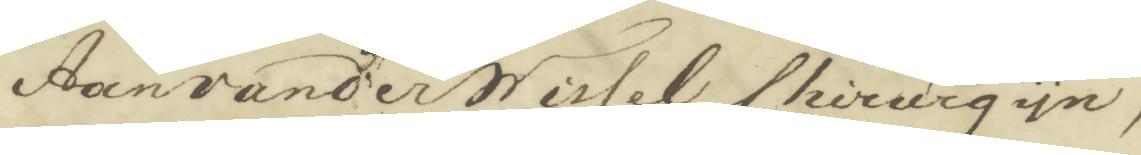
Aan van der Wissel Chirurgijn,
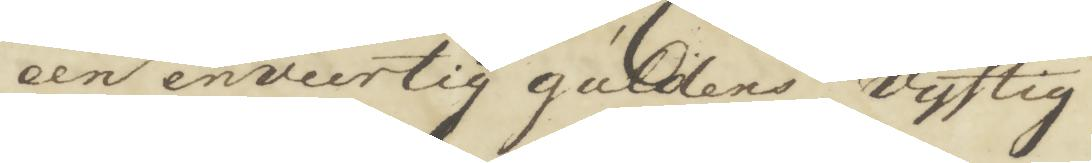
een en veertig guldens vijftig
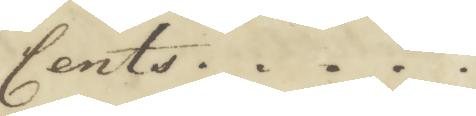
Cents . . . . . . . . . . . . . . . „ 41. 50
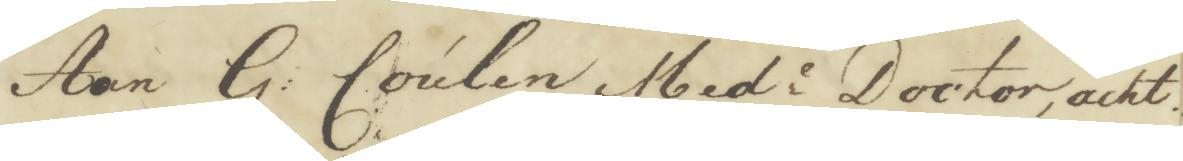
Aan G: Coulen Med„e Doctor, acht„
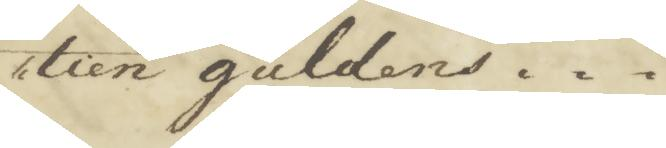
„tien guldens . . . . . . . . . . „ 18. —
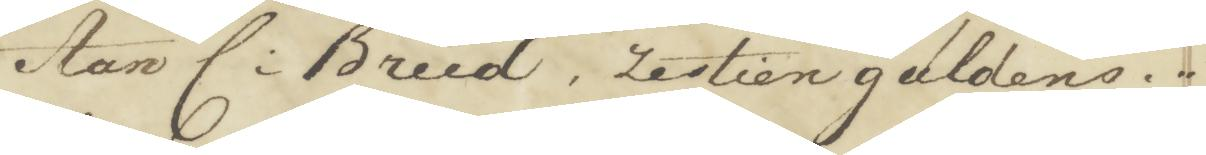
Aan C: Breed, zestien guldens . „ 16. —
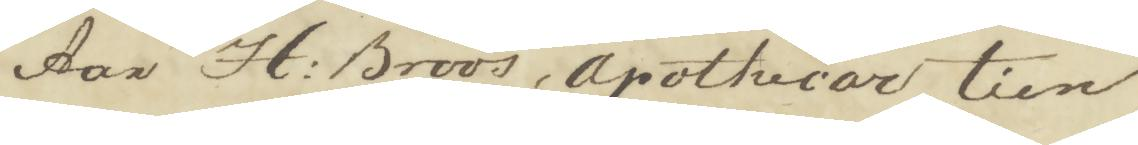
Aan H: Broos, Apothecar, tien
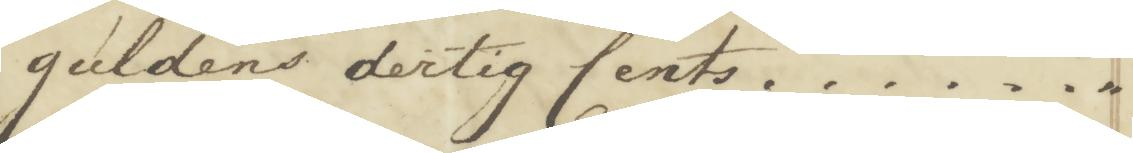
guldens dertig Cents . . . . . . „ 10. 30.
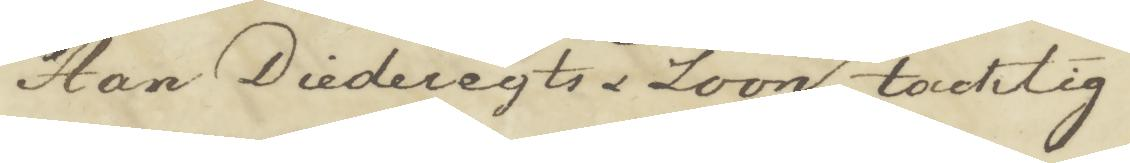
Aan Diederegts & Zoon, tachtig
